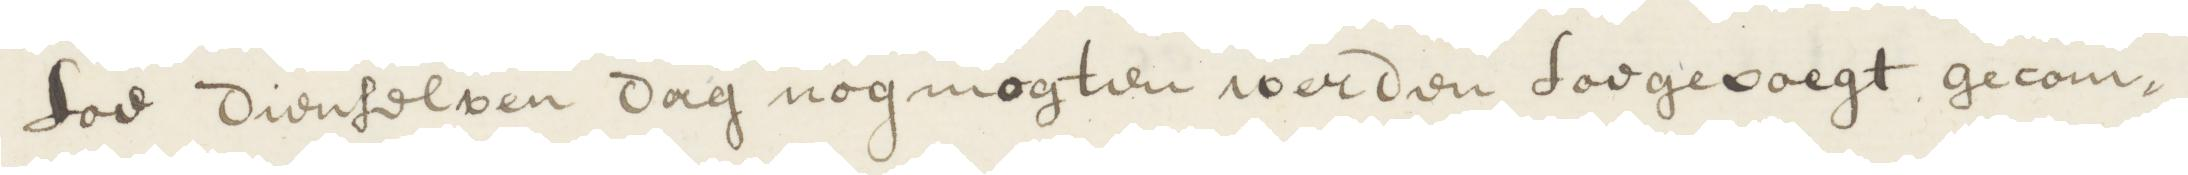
toe dienselven dag nog mogten werden toegevoegt gecom„
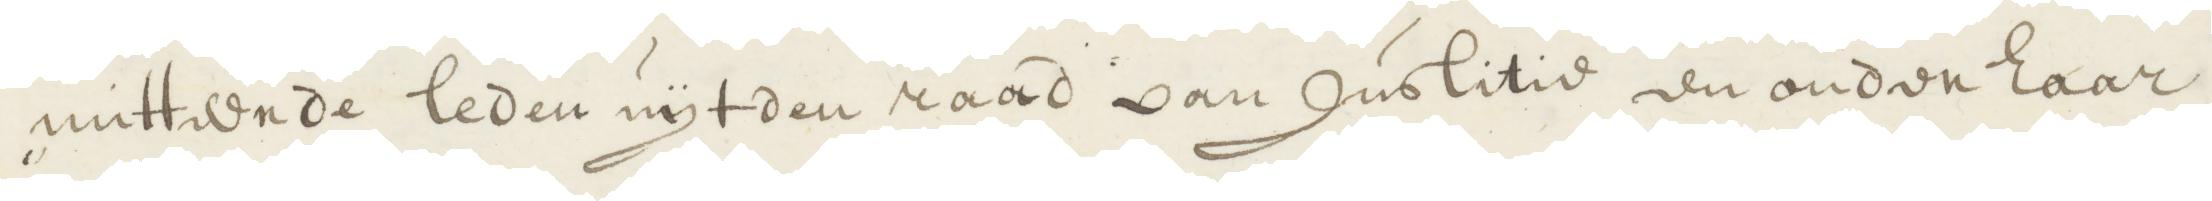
„mitteerde leden uijt den raad van Justitie en onder haar
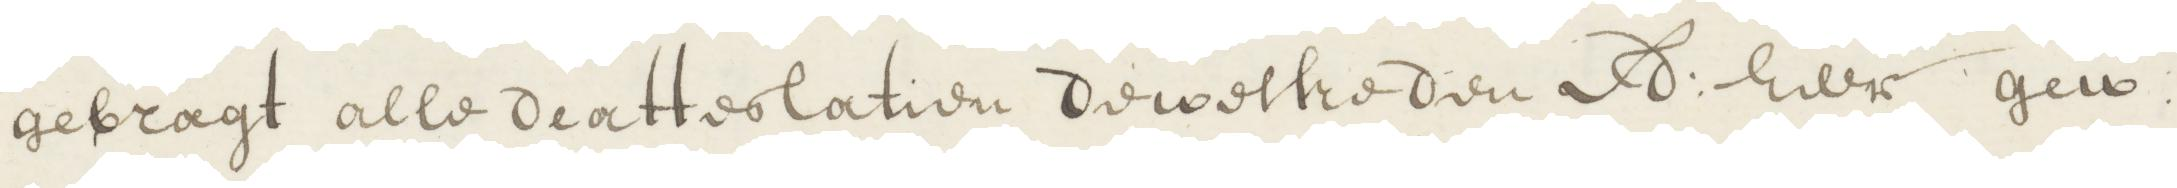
gebragt alle de attestatien dewelke den Ed: heer gew
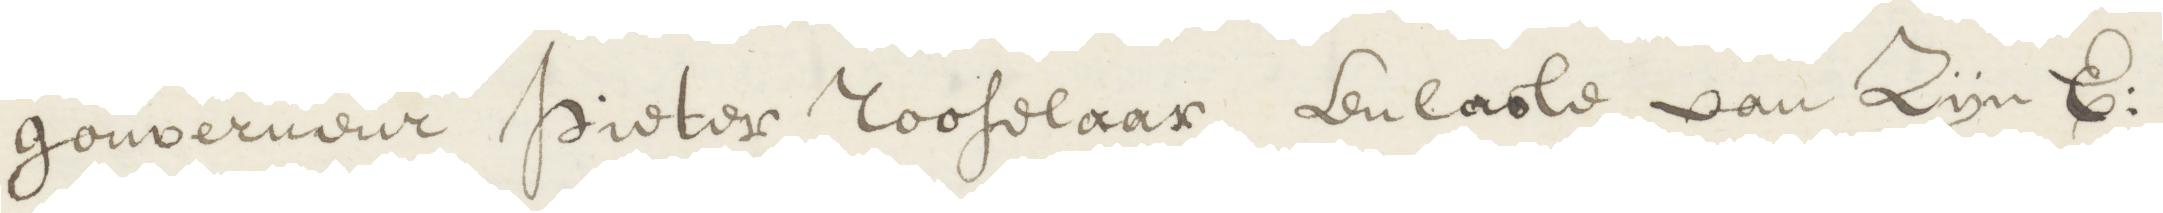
gouverneur Pieter Rooselaar ten laste van zijn E:
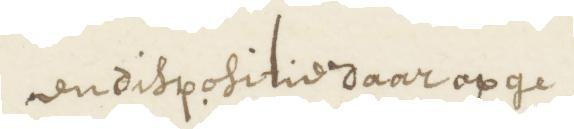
en dispositie daar op ge
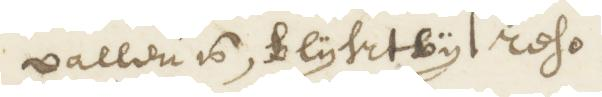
vallen is, blijkt bij reso
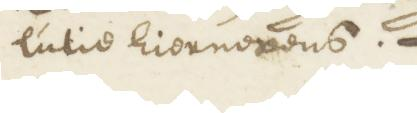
lutie hiernevens.
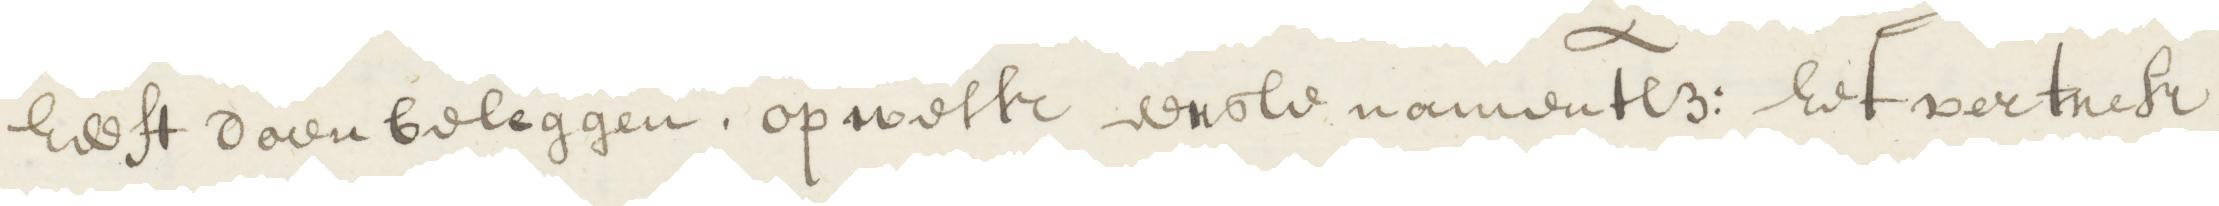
heeft doen beleggen, op welk eerste namentlijk: het vertrek
